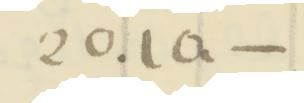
20.10.—
